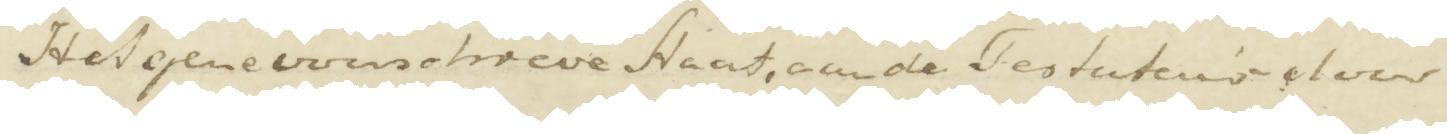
Hetgene voorschreve staat, aan de Testateur door
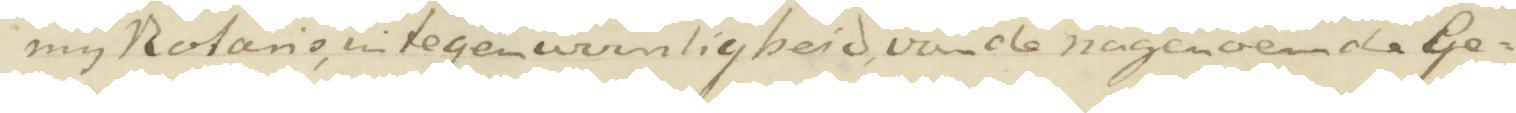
mij Notaris, in tegenwoordigheid, van de nagenoemde Ge=
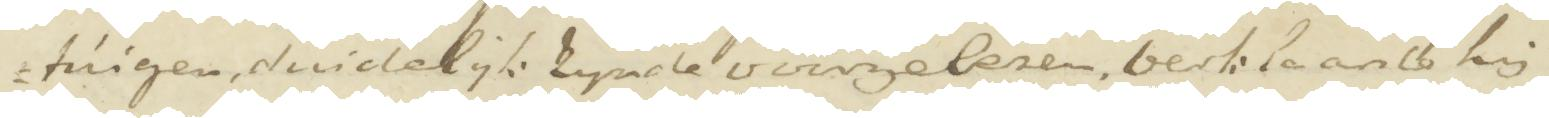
=tuigen, duidelijk zynde voorgelezen, verklaarde hij
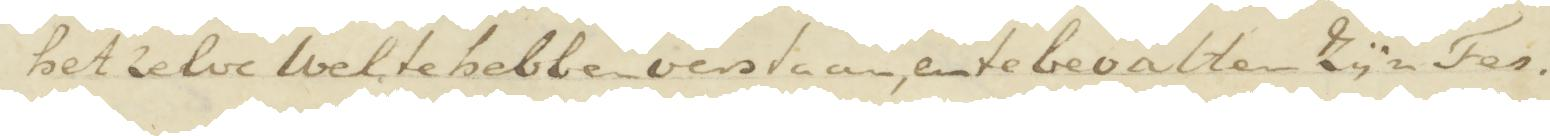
het zelve wel te hebben verstaan, en te bevatten zijn Tes.
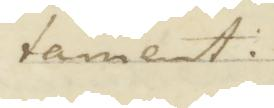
tament:
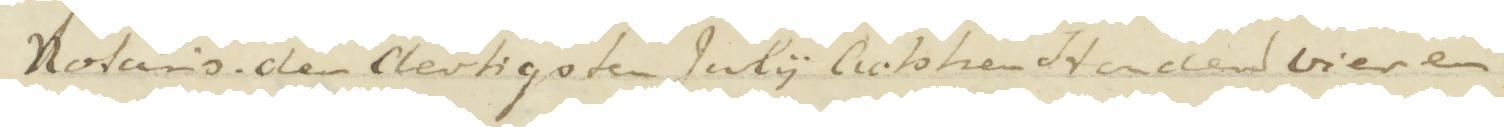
Notaris, den dertigsten Julij Achtien Honderd vier en
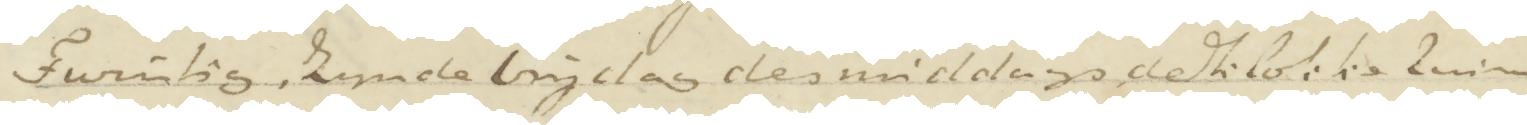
Twintig, Zynde vrijdag des middags de klokke ruim
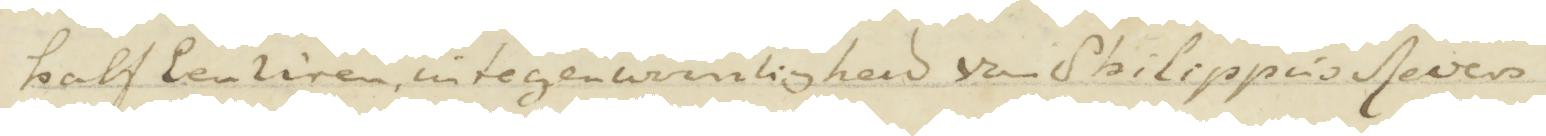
half Een uren, in tegenwoordigheid van Philippus Revers
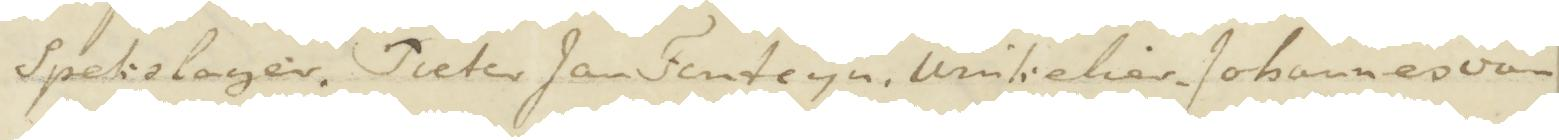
spekslager, Pieter Jan Fonteijn, Winkelier, Johannes van
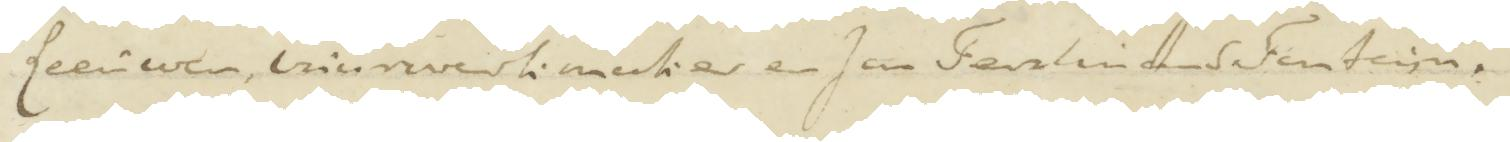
Leeuwen, vuurwerkmaker en Jan Ferdinand Fontein,
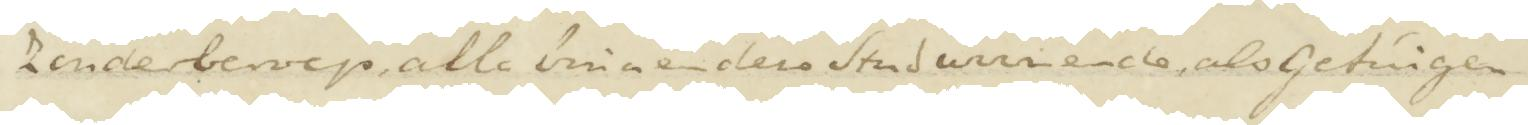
zonder beroep, alle binnen deze stad woonende, als Getuigen
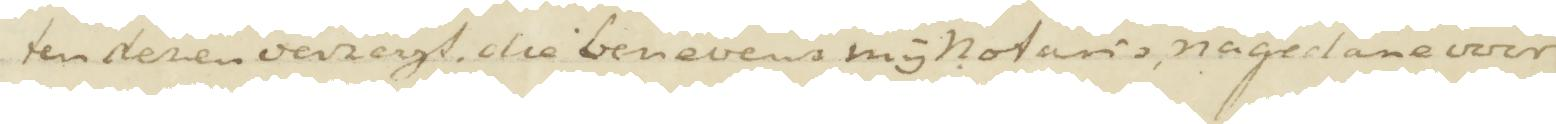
ten dezen verzogt, die benevens mij Notaris, nagedane voor
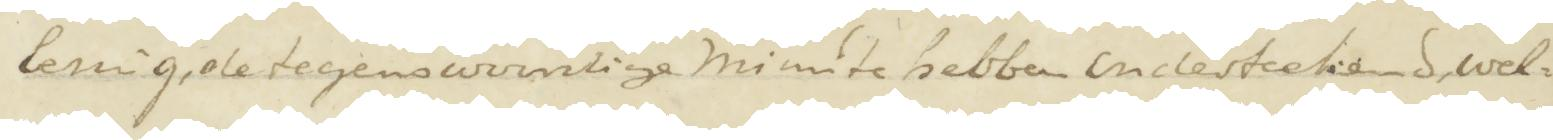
lezing, de tegenswoordige Minute hebben ondertekend wel=
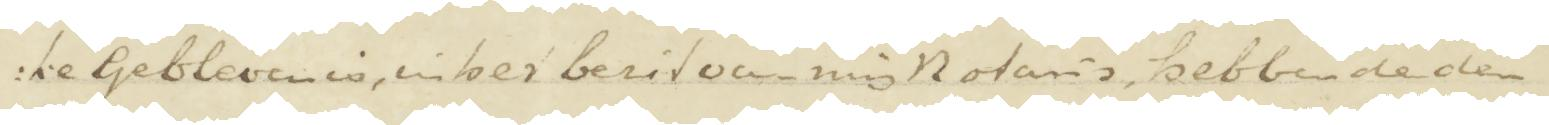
„ke Gebleven is, in het bezit van mij Notaris, hebbende den
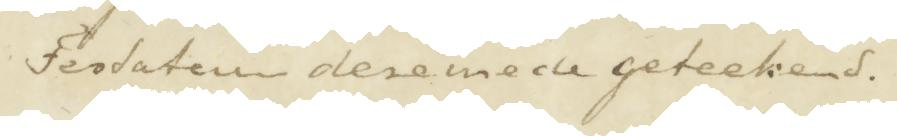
Testateur deze mede geteekend.
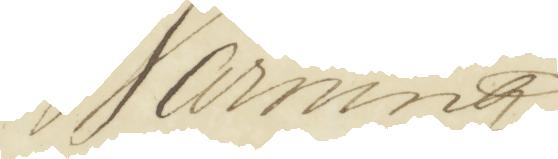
J. Warning
